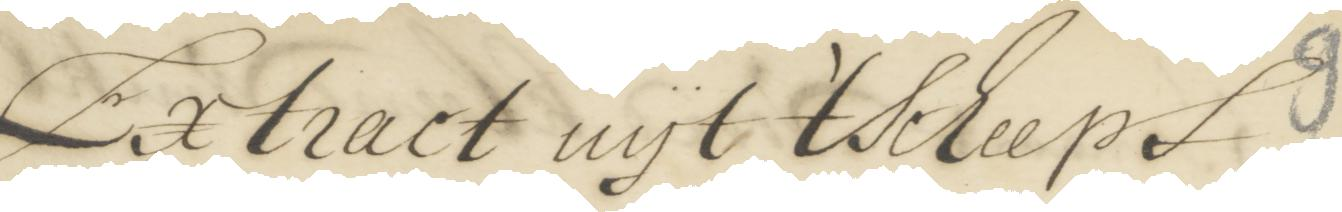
Extract uijt ’tscheeps 9
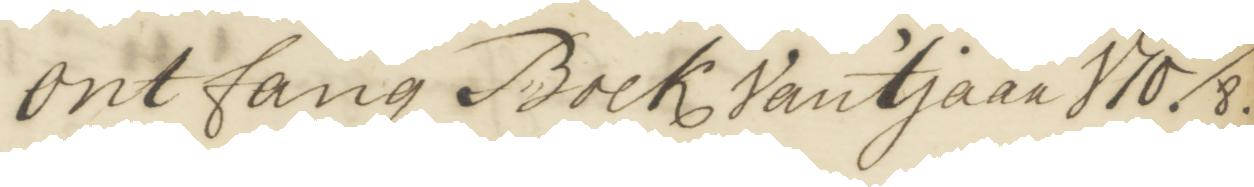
ontfang Boek van’tjaar 170.7/8.
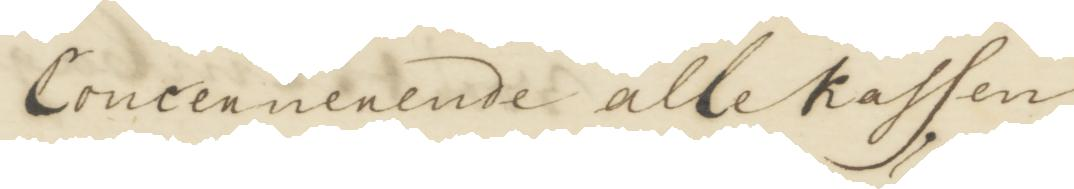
Concernerende alle kassen
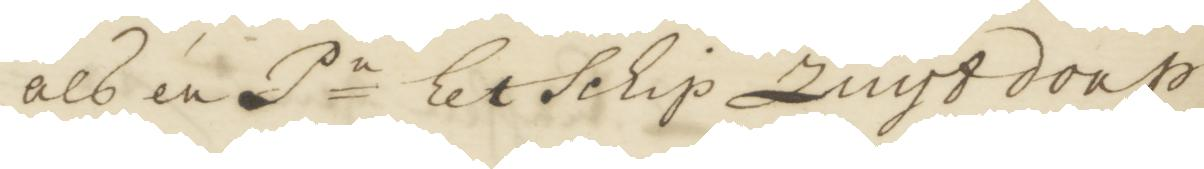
als en P=r het schip Zuijtdorp
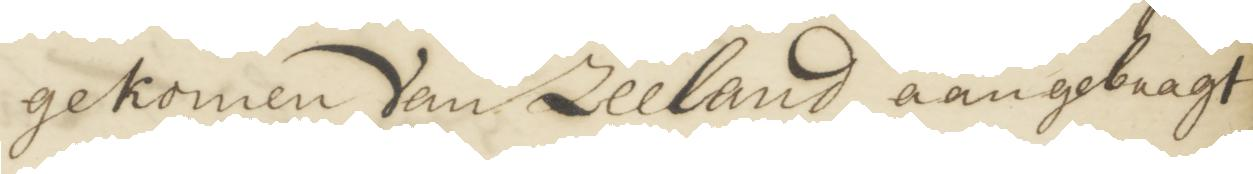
gekomen Van Zeeland, aan gebragt
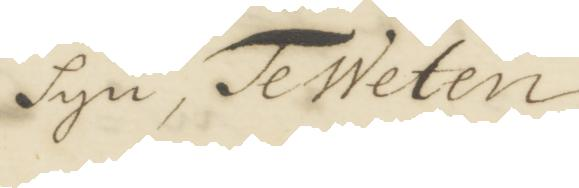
sijn, Teweten
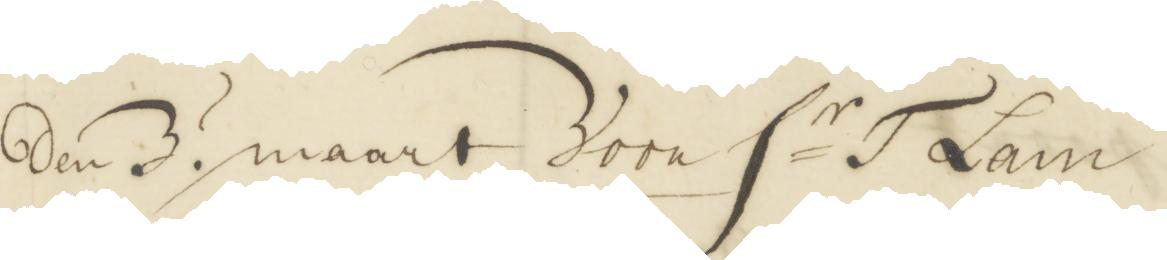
den 3'. maart Voor s=r 'T Lam
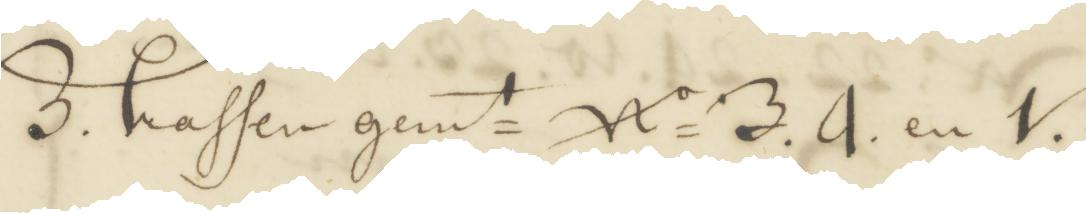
3. kassen gem=t n=o 3. 4. en 1.
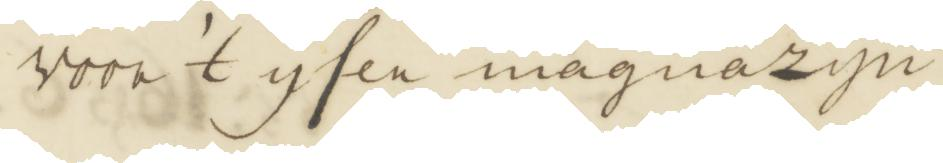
voor ’t ijser maguazijn
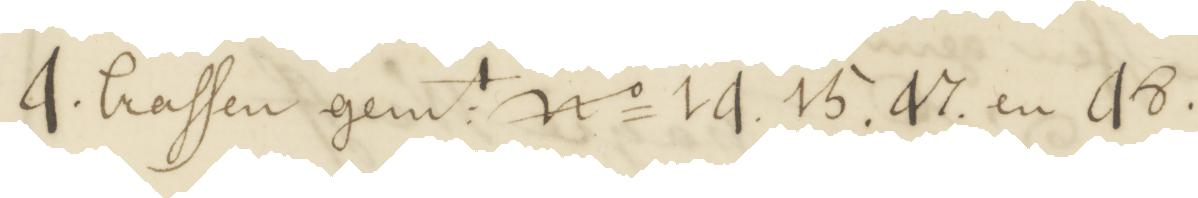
4. kassen gem:t n=o 14. 15. 47. en 48.
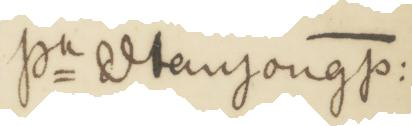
P=r detenjongs:
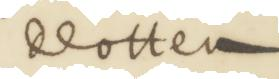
deotten
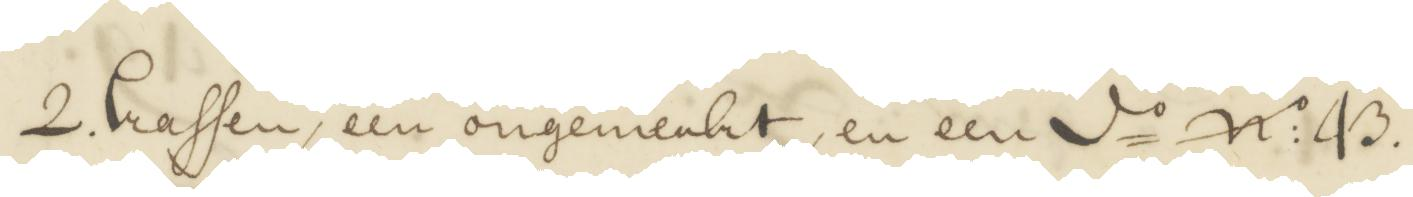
2. kassen, een ongemerkt, en een d=o n:o 43.
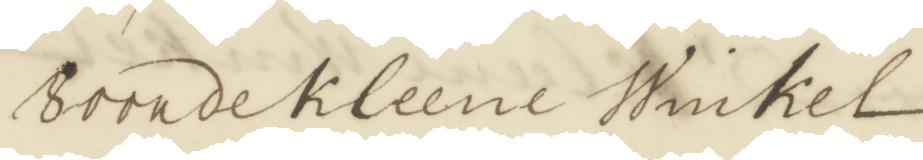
Voor de kleene Winkel
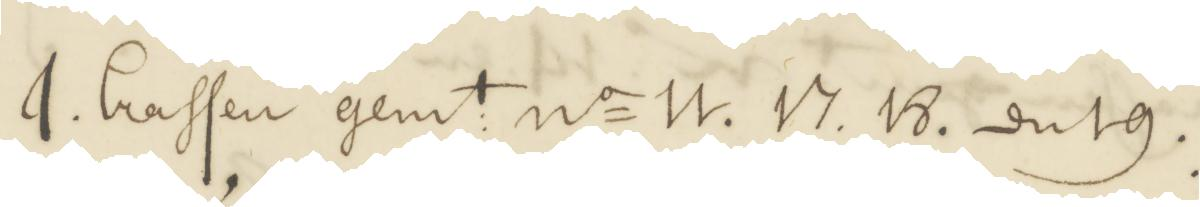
4. kassen gem:t n=o 11. 17. 18 en 19.
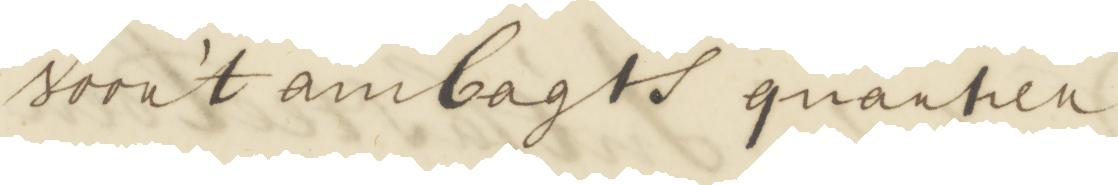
Voor ’t ambagts quartier
